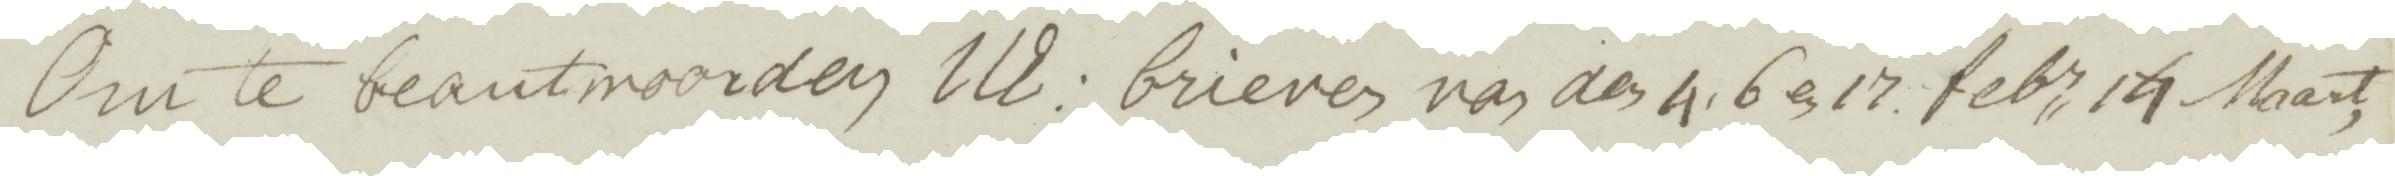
Om te beantwoorden UE: brieven van den 4. 6en 17. feb„r 14 Maart,
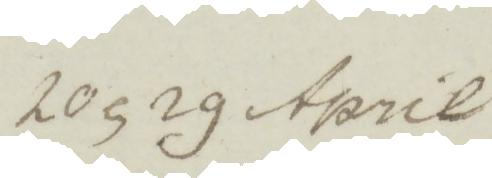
20 en 29 April
